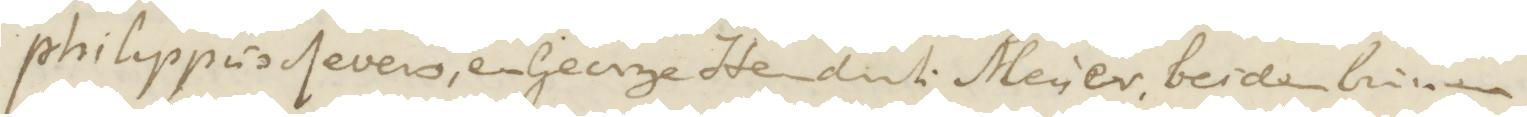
philippus Revers, en George Hendrik Meijer, beiden binnen
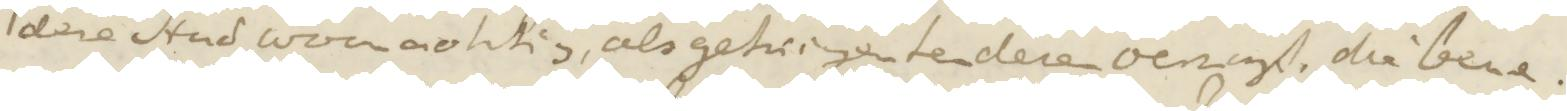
deze stad woonachtig, als getuigen ten deze verzogt, die bene.
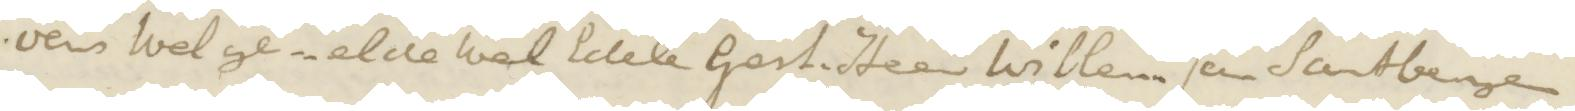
vens wel gemelde wel Edele Gest. Heer Willem Jan Santbergen
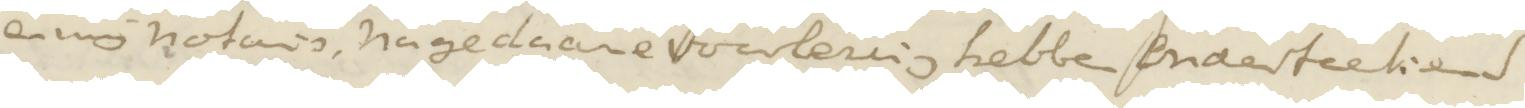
en mij notaris, nagedaane voorlezing hebben onderteekend
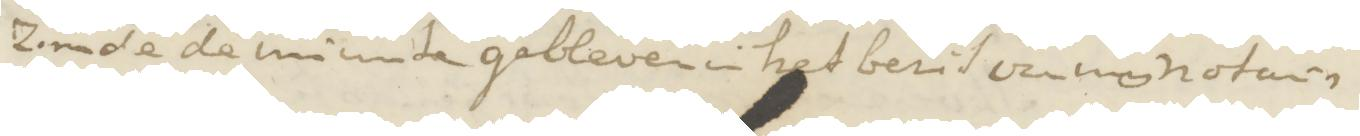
Zynde de minute gebleven in het bezit van my Notaris
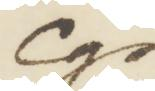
WJ
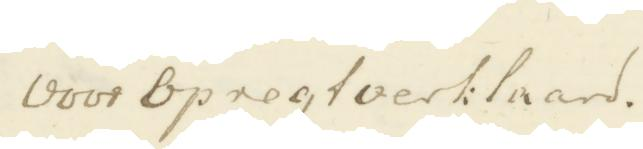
voor Opregt verklaard.
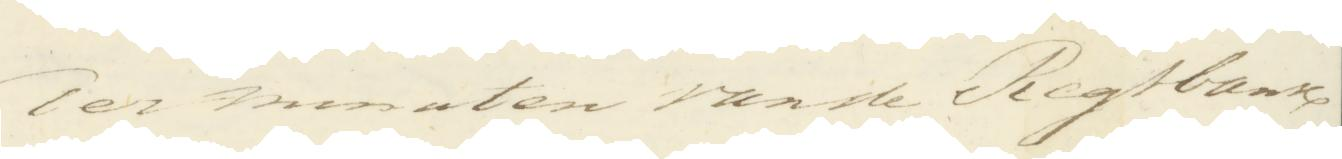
der minuten van de Regtbank
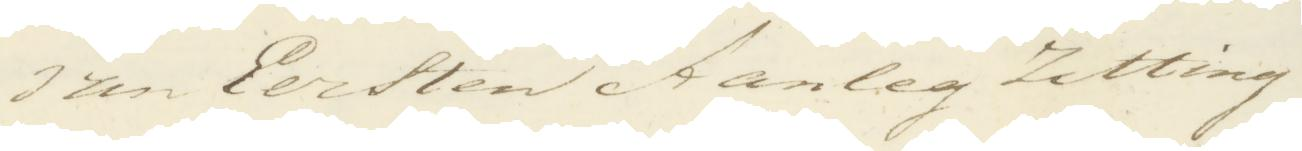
van Eersten Aanleg Zitting
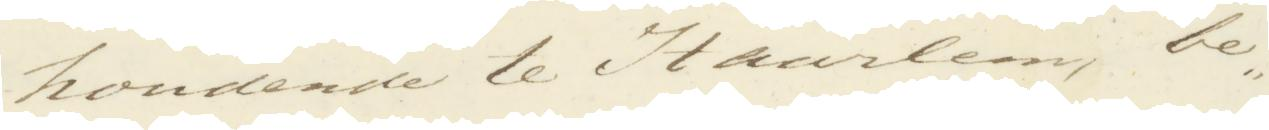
houdende te Haarlem, be„
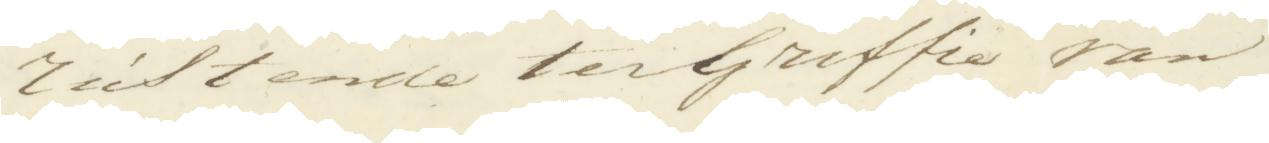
rustende ter Griffie van
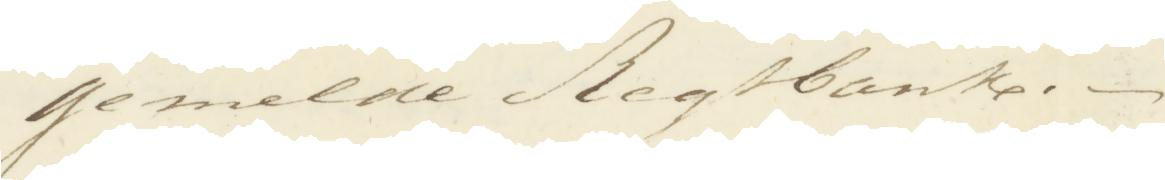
gemelde Regtbank.—
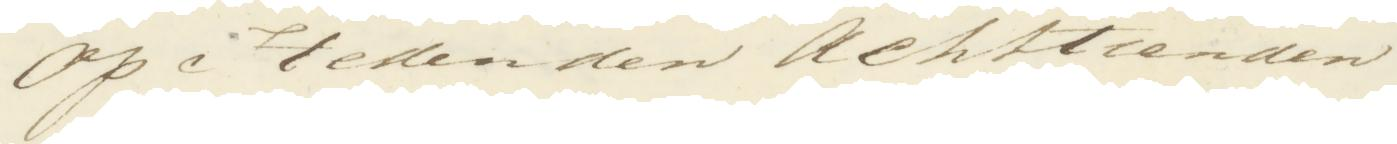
op Heden den Achttienden
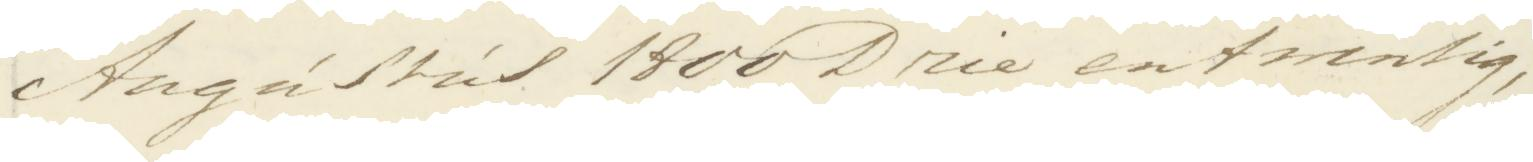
Augustus 1800 Drie en twintig,
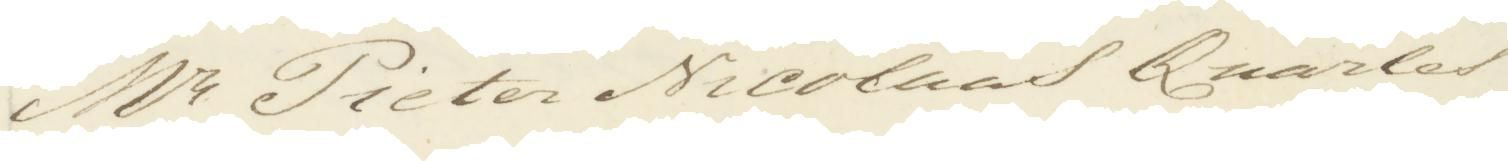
Mr Pieter Nicolaas Quarles
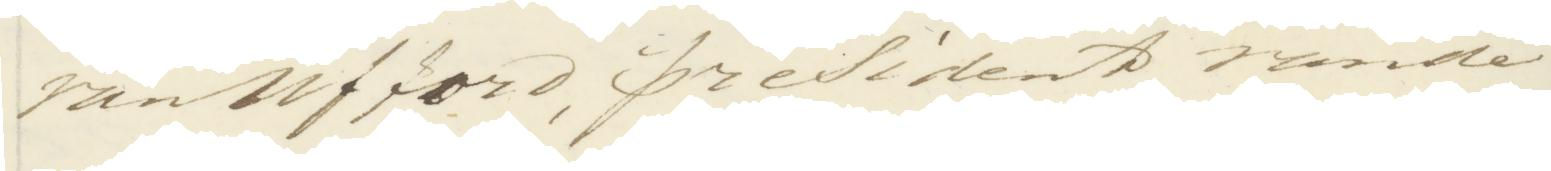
van Ufford, president van de
